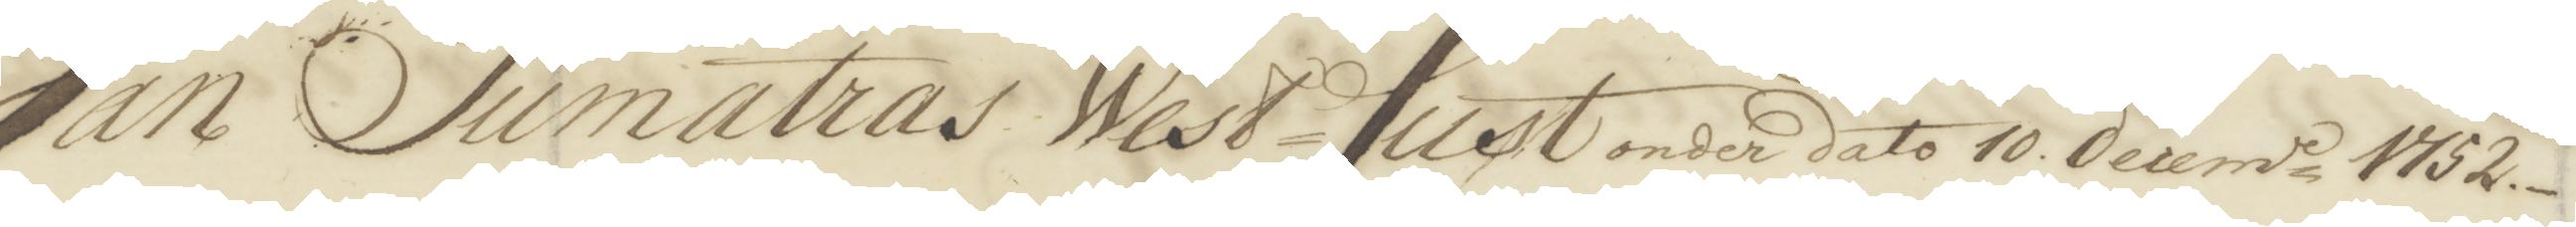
Van Sumatras West=Cust onder dato 10. decem=r 1752.
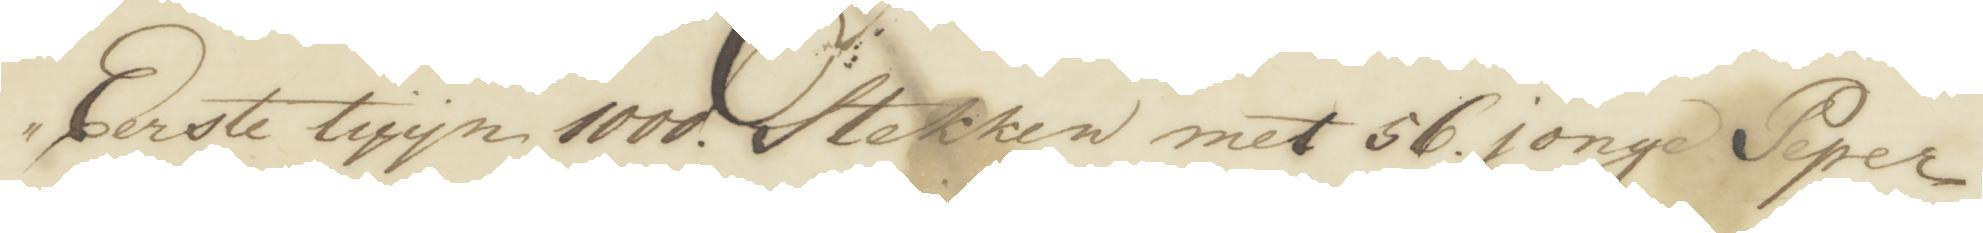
„ Eerste tyijn 1000. Stekken met 56. jonge Peper
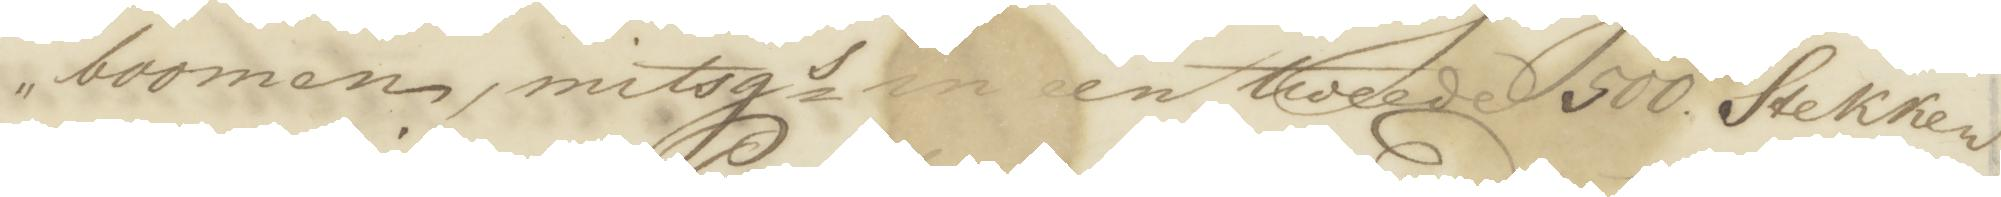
„ boomen, mitsg=s in een tweede 500. Stekken
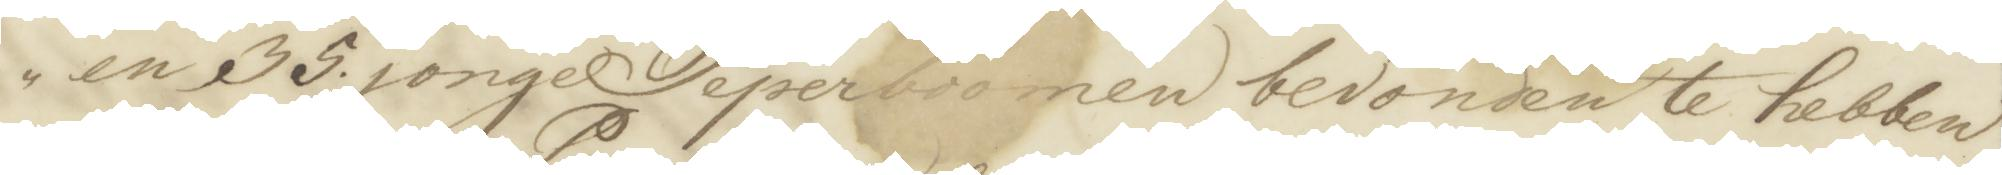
„ en 35. jonge Peperboomen bevonden te hebben,
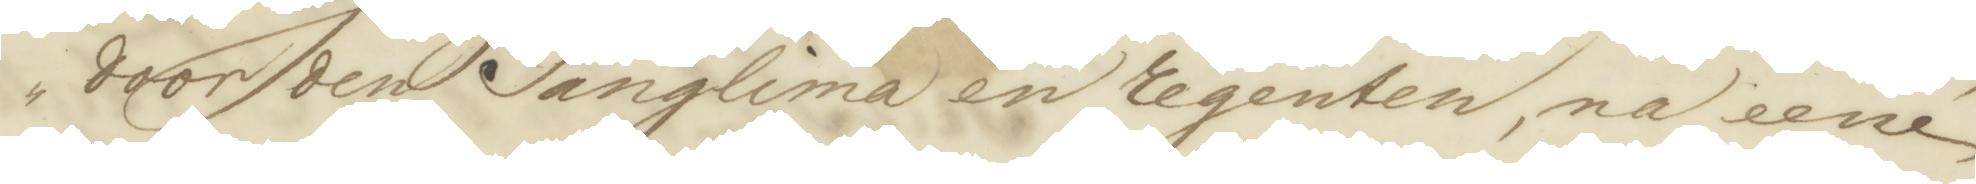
„ door den Panglima en regenten, na eene
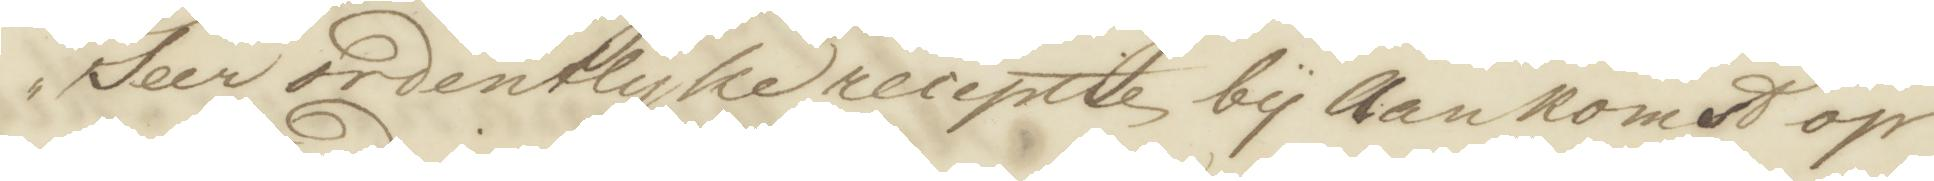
„ Seer ordentlyke receptie bij Aankomst op
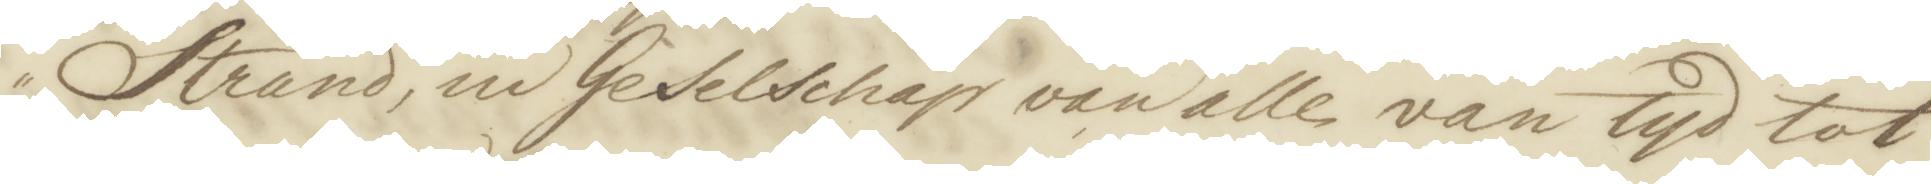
„ Strand, in Geselschap van alle van tyd tot
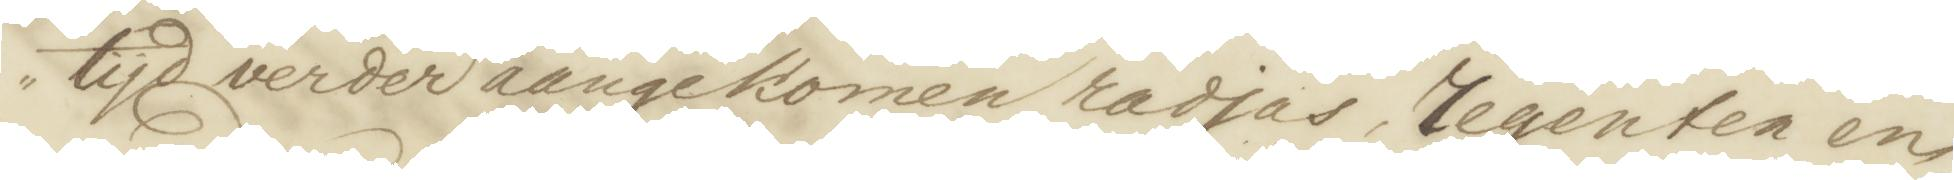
„ tijd verder aangekomen radjas, regenten en
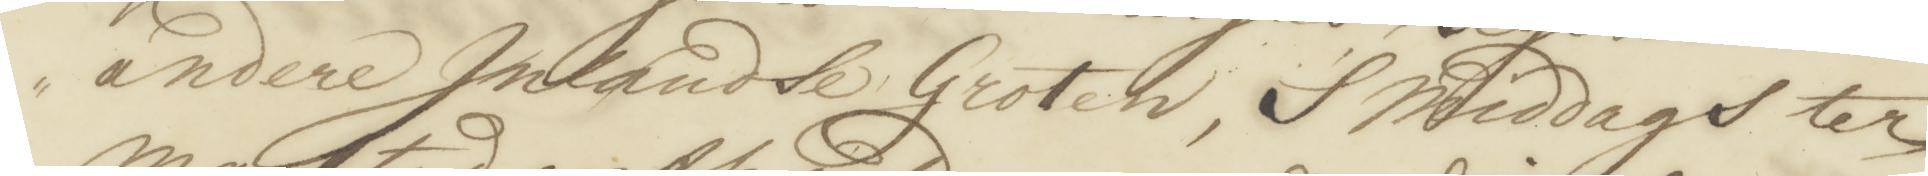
„ andere Jnlandse Groten, 'S middags ter
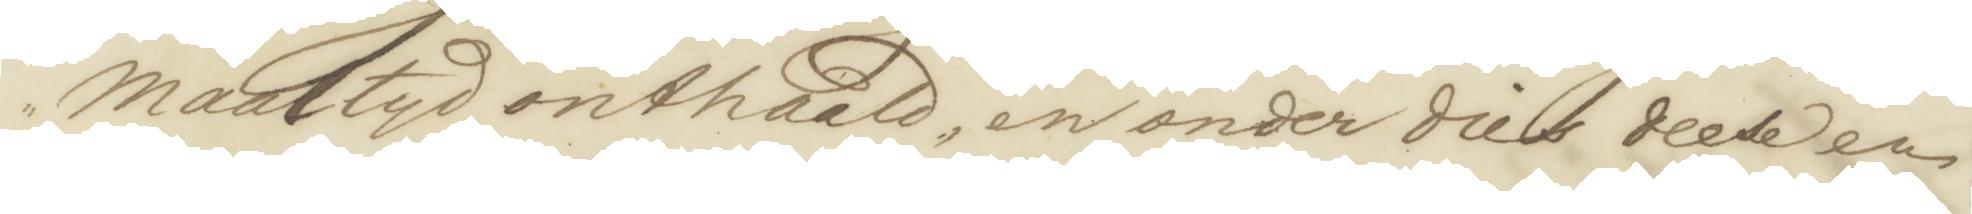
„ maaltyd onthaald, en onder dies deese en
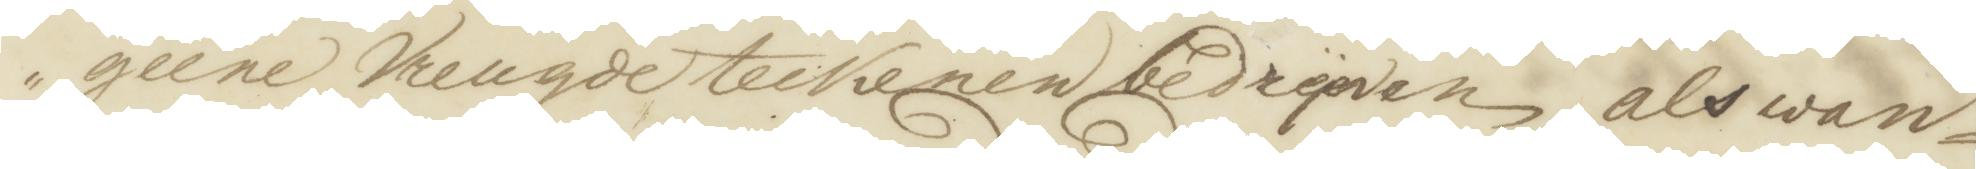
„ geene Vreugde teekenen bedreijven als wan=
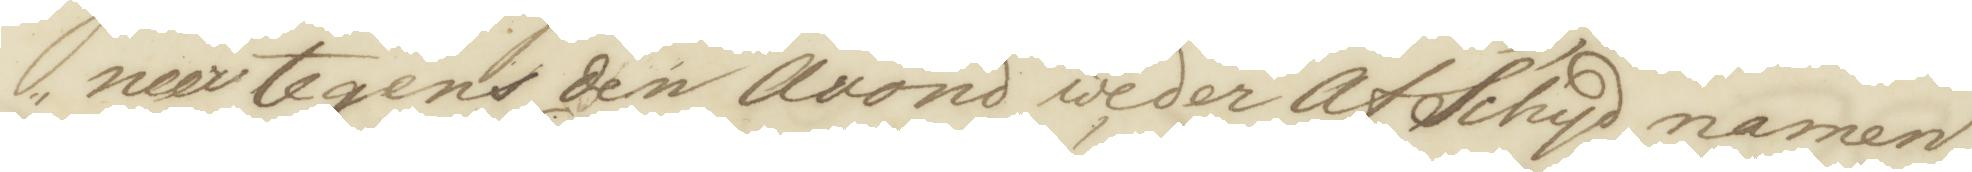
„ neer tegens den Avond weder afschyd namen,
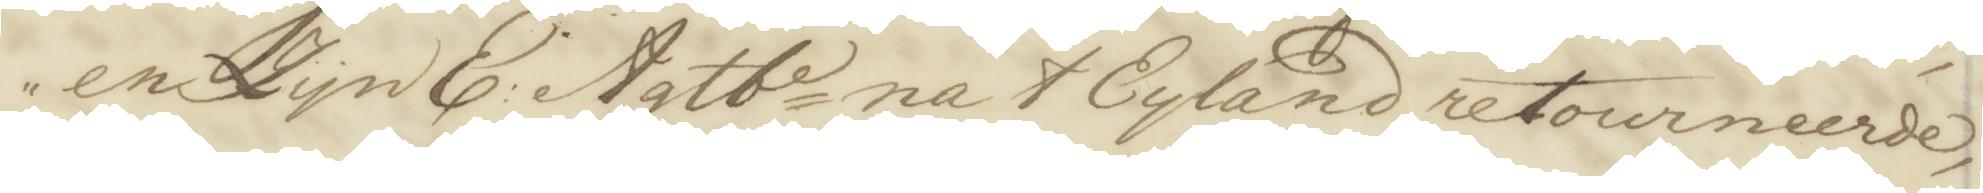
„ en Zijn E: Agtb=e na ’t Eyland retourneerde,
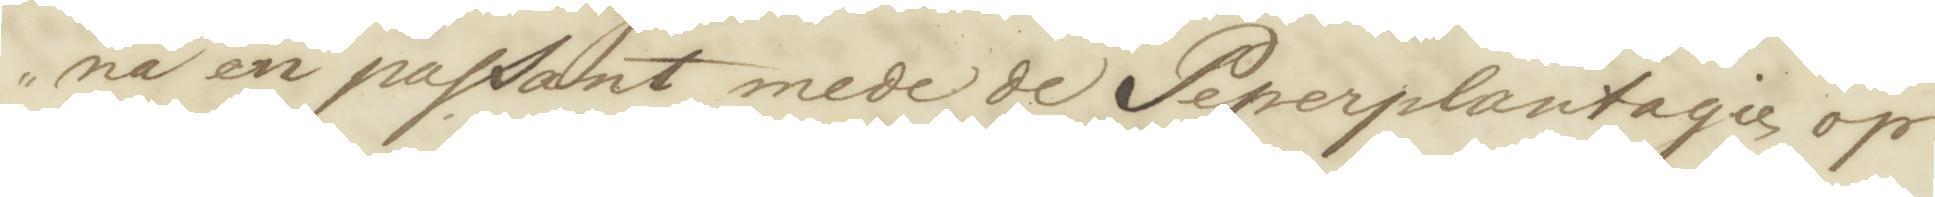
„ na en passant mede de Peperplantagie op
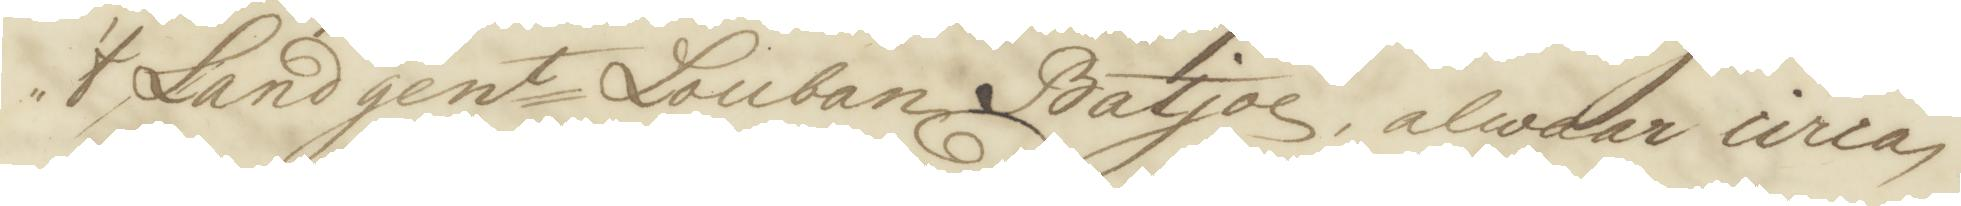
„’t Land gen=t Louban Batjoe, alwaar circa
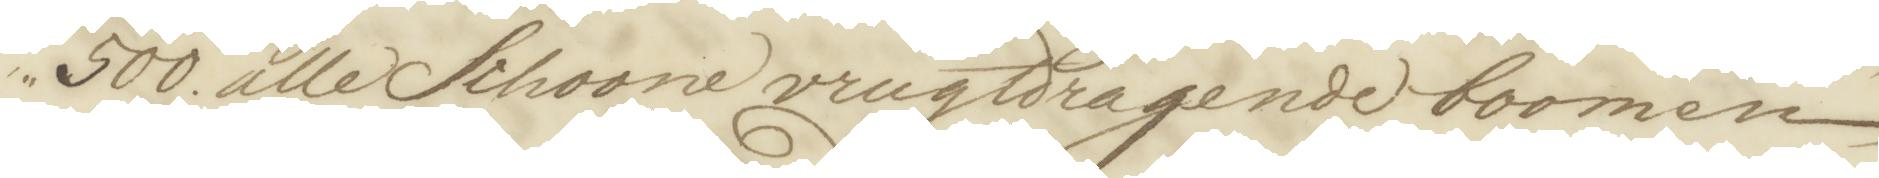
„500. alle schoone vrugtdragende boomen
